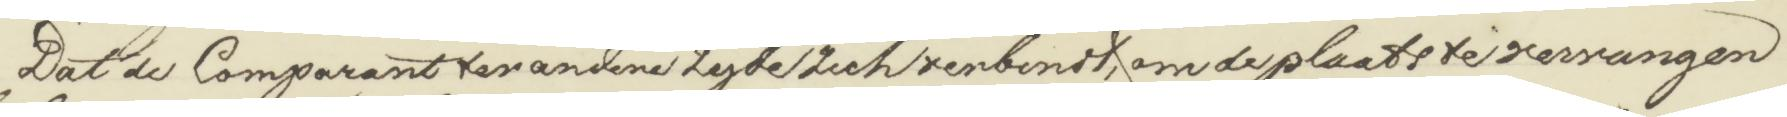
Dat de Comparant ter andere zyde zich verbindt, om de plaats te vervangen
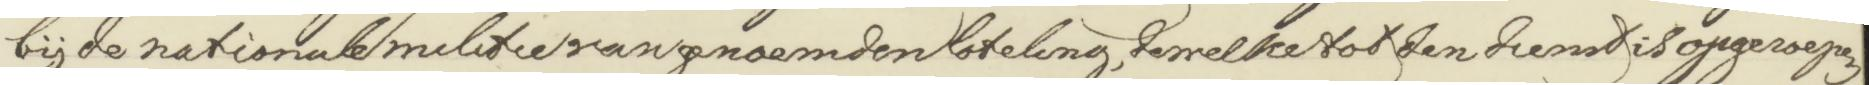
bij de nationale militie van genoemden loteling, dewelke tot den dient is opgeroepen
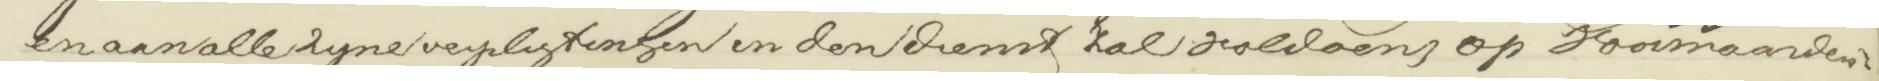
en aan alle zyne verpligtingen in den dienst zal voldoen, op voorwaarden
